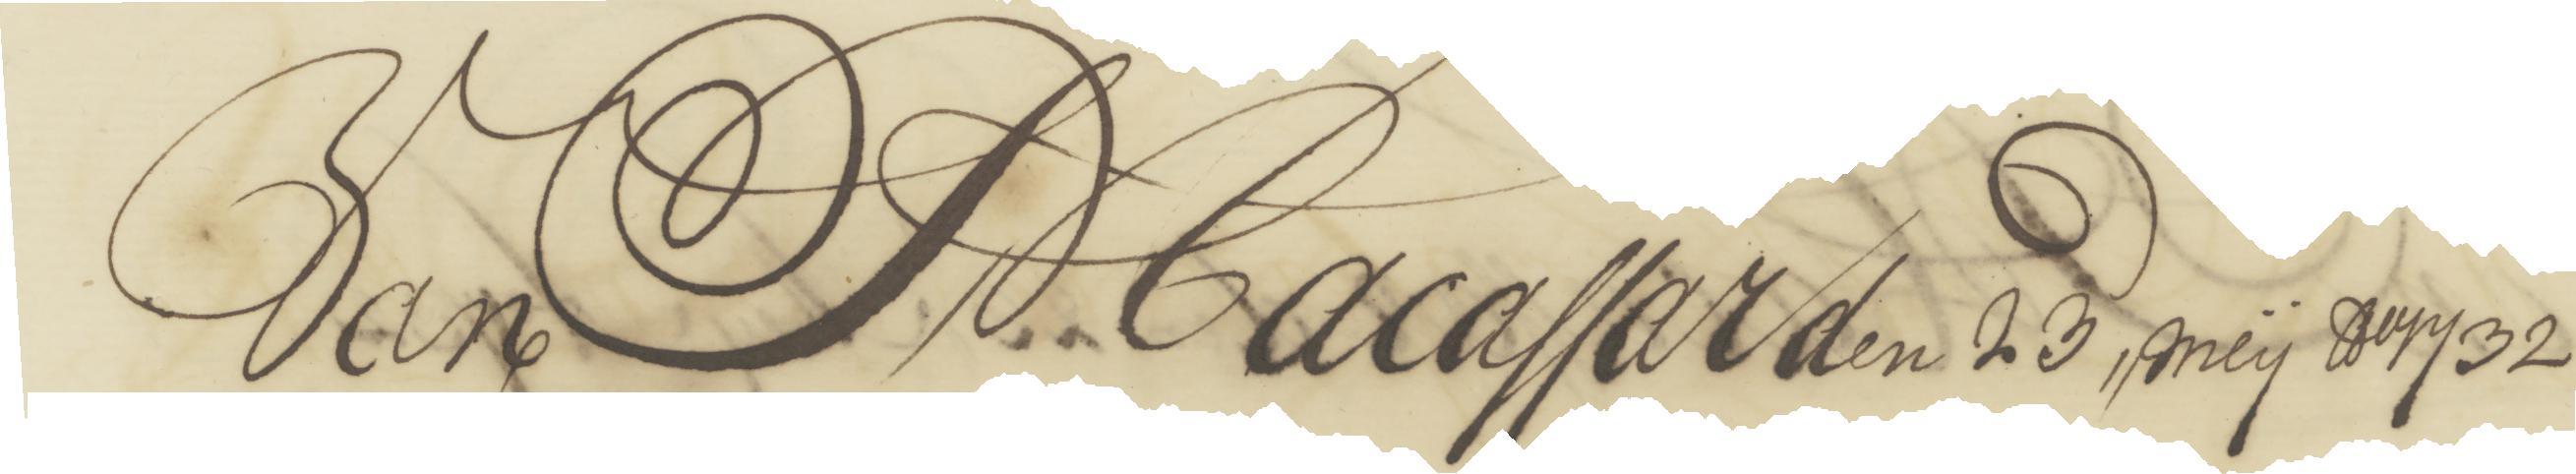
Van Macassar den 23„' Meij Ao 1732.
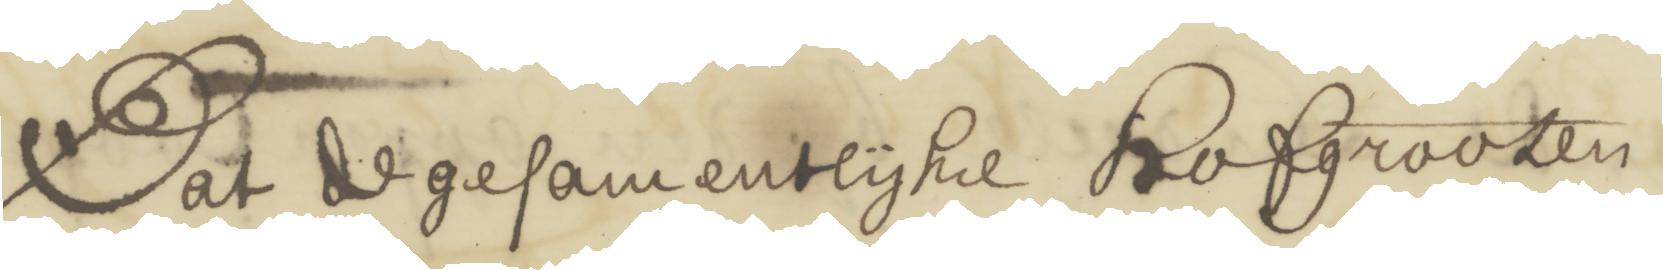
Dat de gesamentlijke Hofgrooten
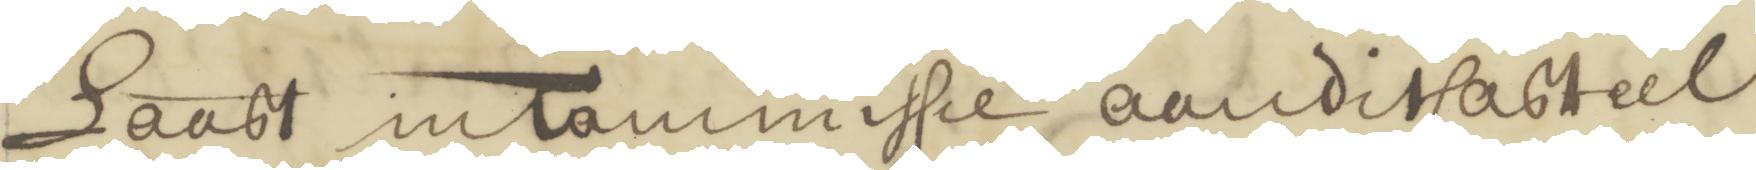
Laast in commissie aandit Casteel
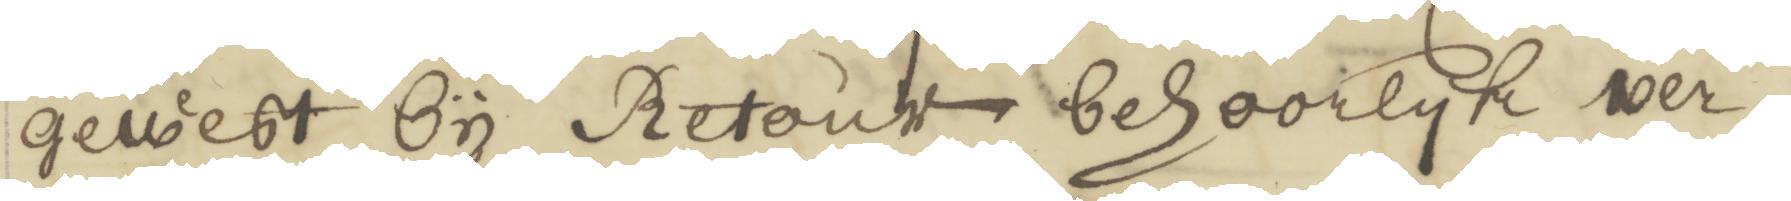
geweest bij Retour behoorlijk ver
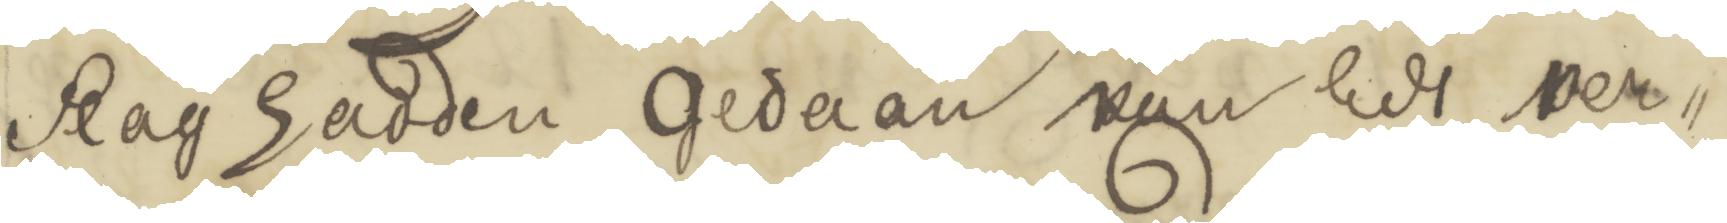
slag hadden gedaan van het ver„
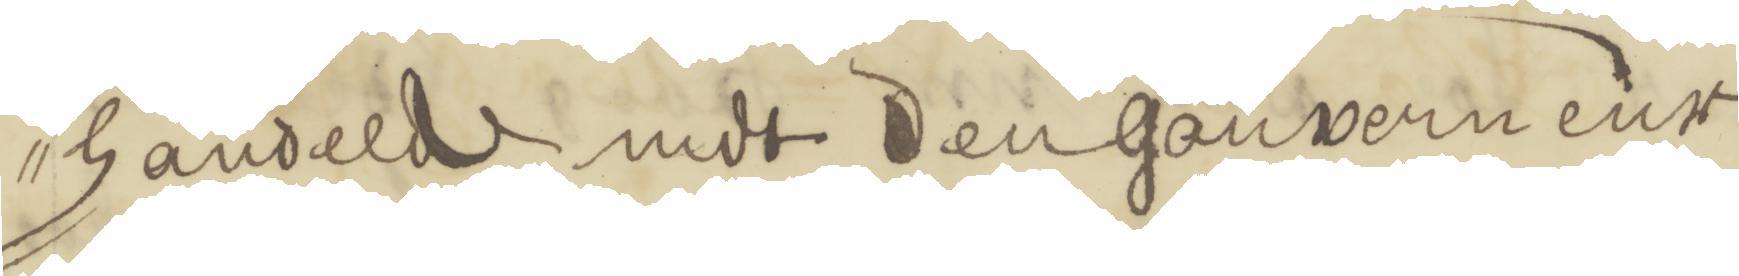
„handelde met den gouverneur
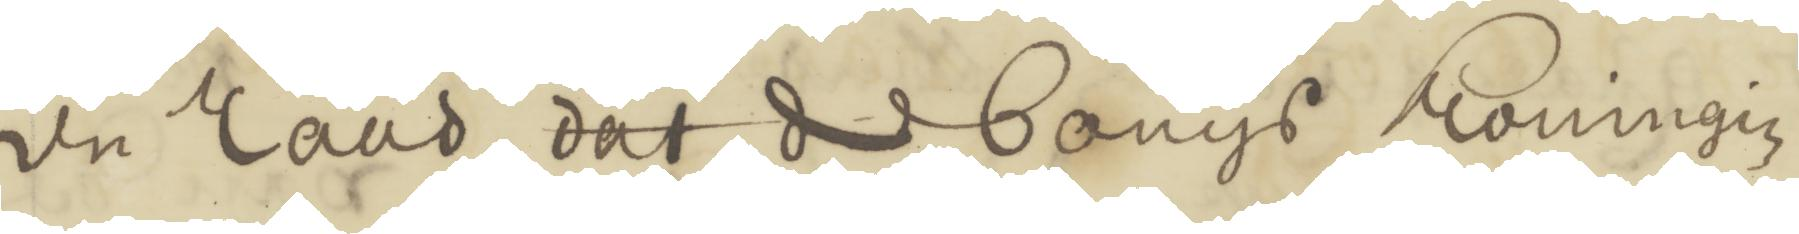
en raad, dat de bonys koningin
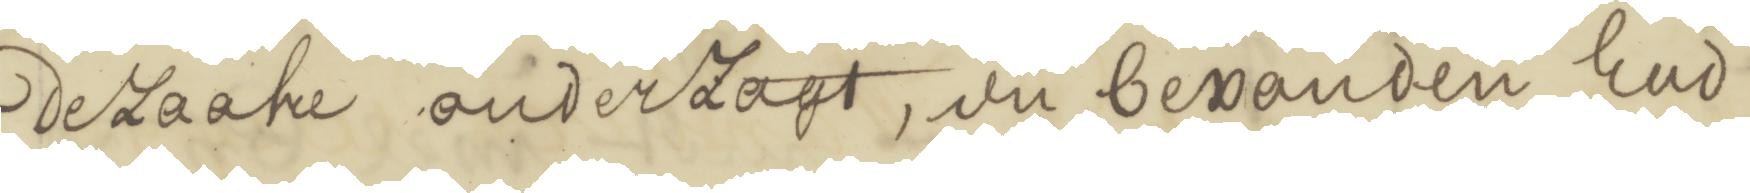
dezaake onderzogt, en bevonden had
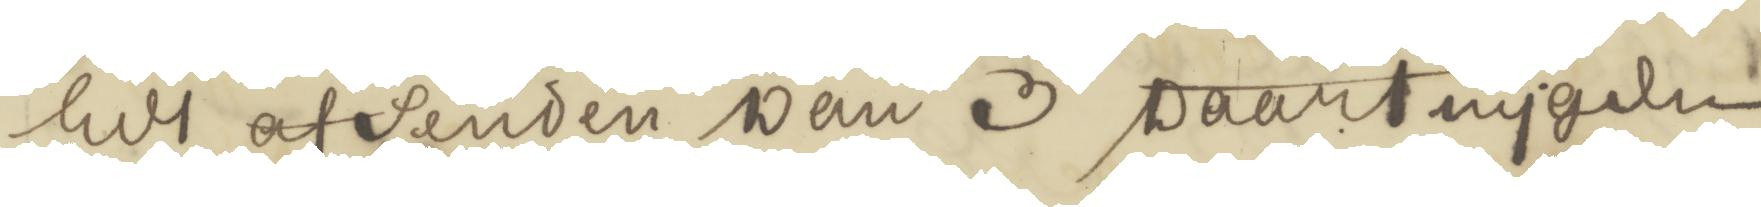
het afsenden van 3 vaartuijgen
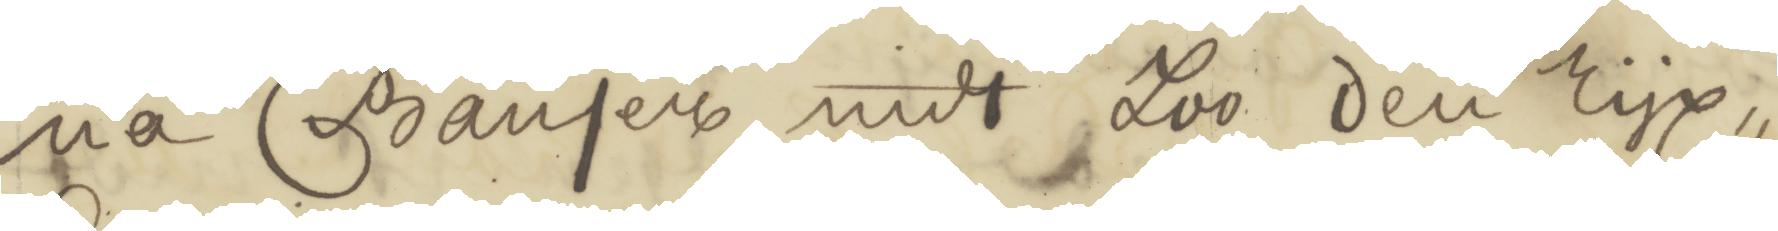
na Banjer met zoo den rijx„
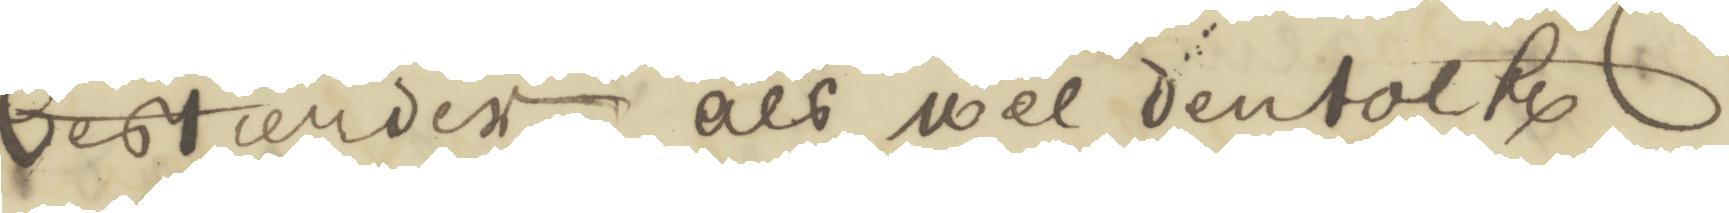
bestierder, als wel den tolk
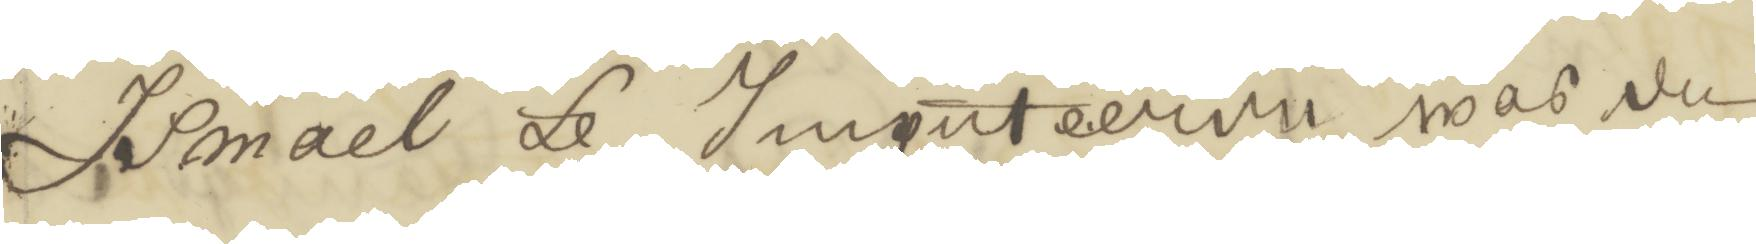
Ismael te Imputeeren was en
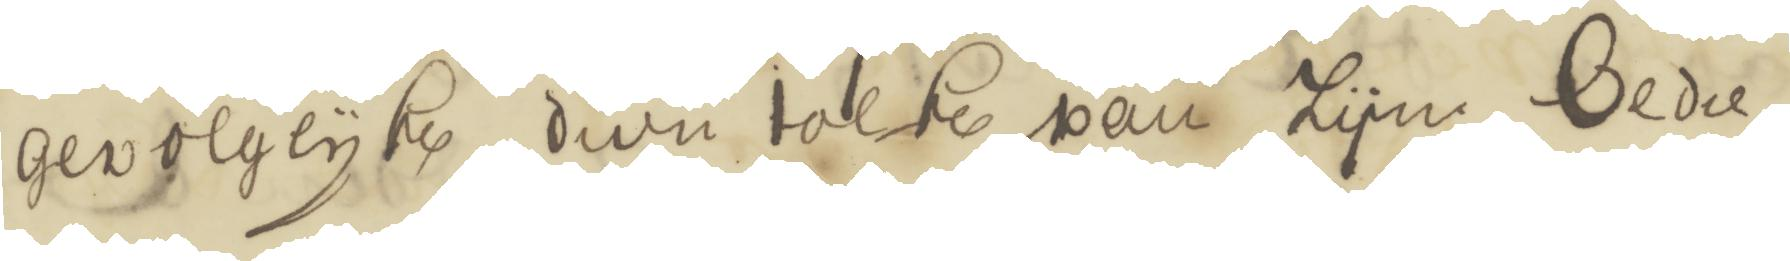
gevolglijk dien tolk van zijn bedie
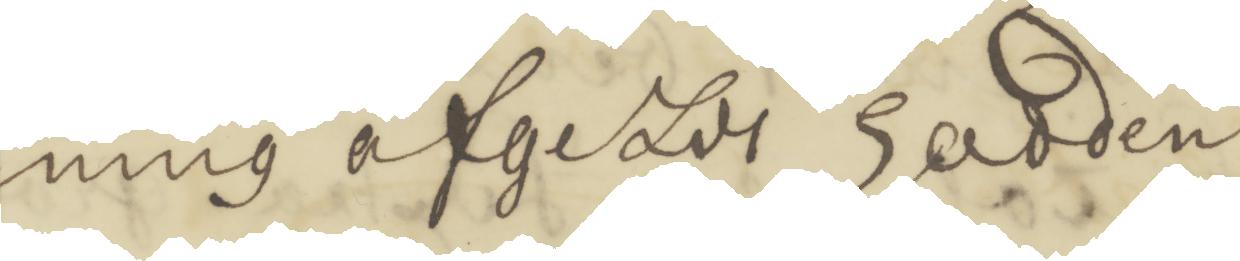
ning afgezet hadden
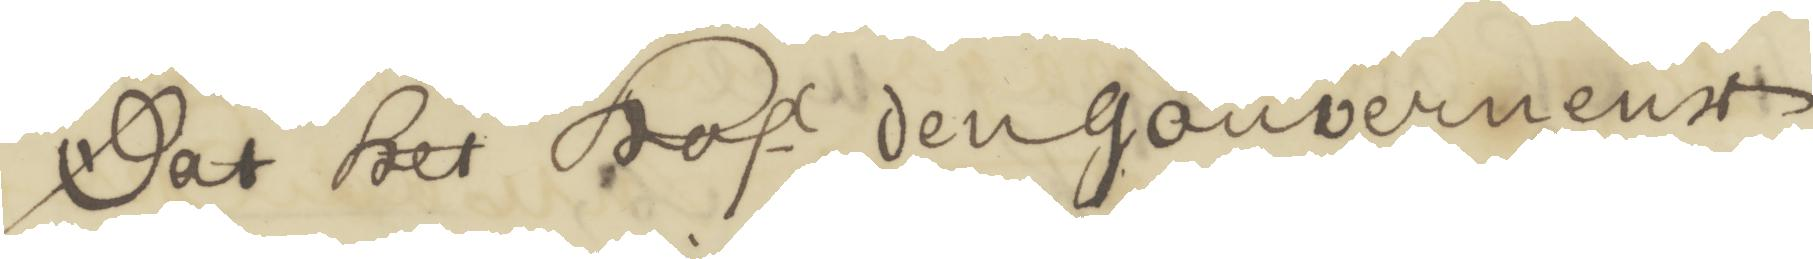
Dat het Hof den gouverneur
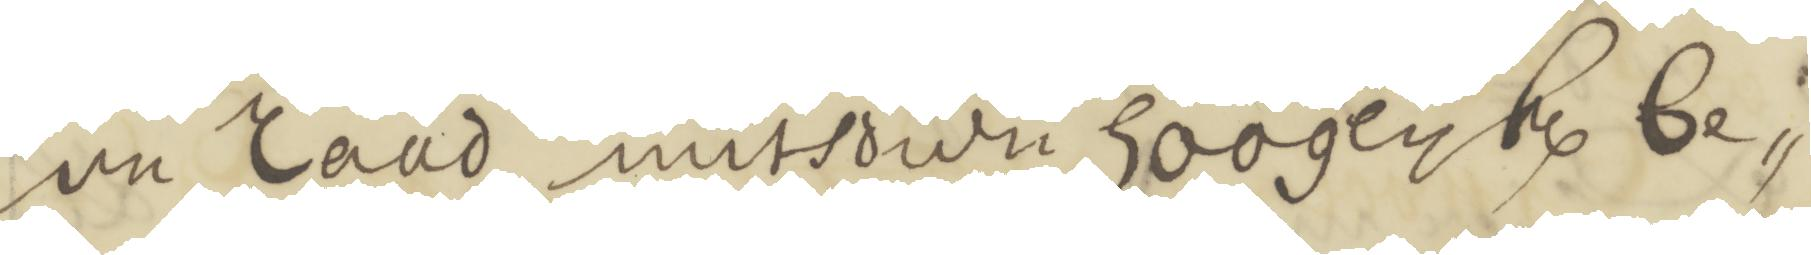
en Raad mitsdien hooglijk be„
